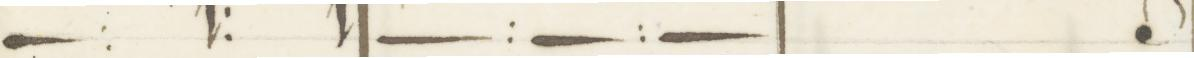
—: 1: 1 —:—:— 3
